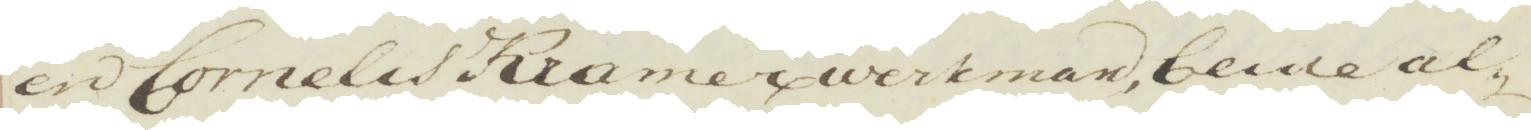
en Cornelis Kramer werkman, beide al„
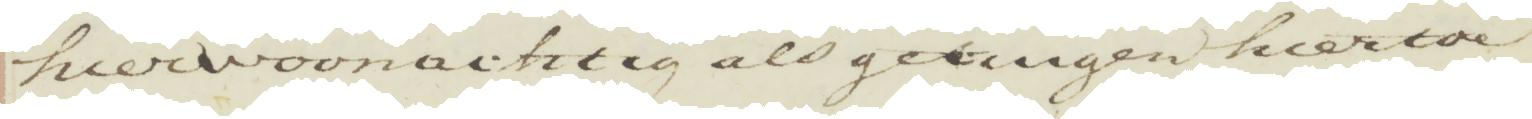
hier woonachtig als getuigen hier toe
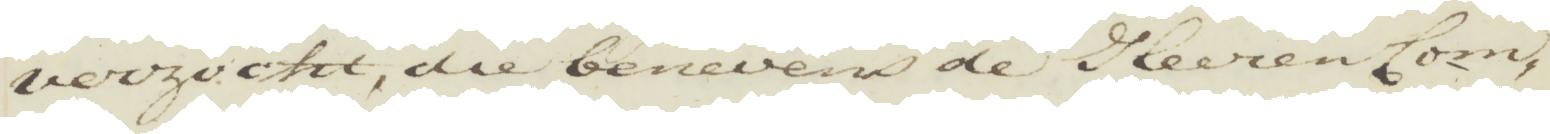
verzocht, die benevens de Heeren Com„
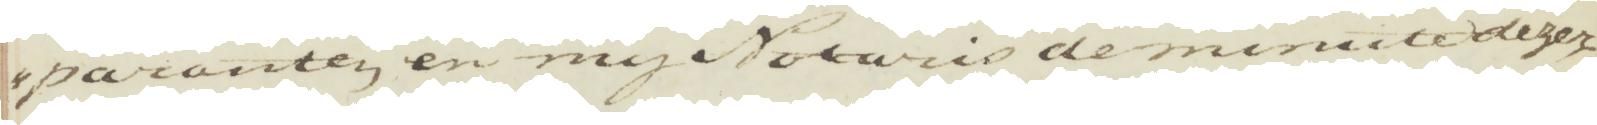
„paranten en my Notaris de minute dezer,
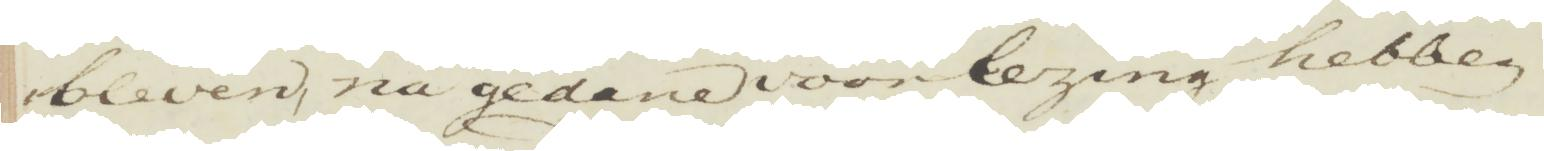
bleven, na gedene voorlezing hebben
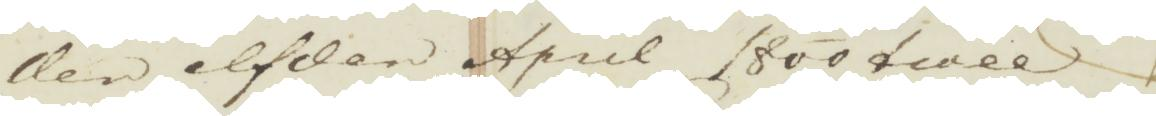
den elfden April 1800 twee
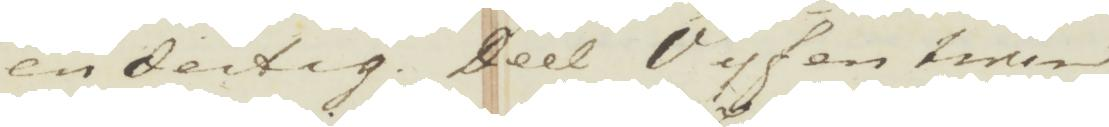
en dertig. Deel Vyf en twin
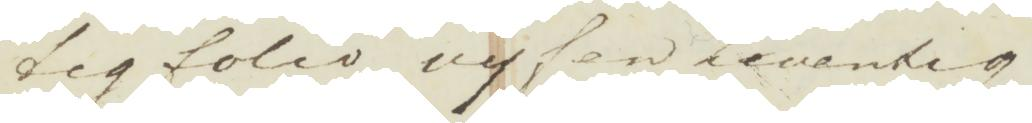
tig folio vyf en zeventig
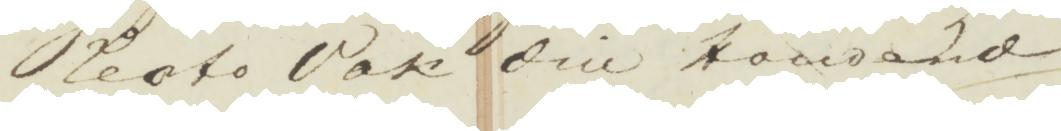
Recto Vak drie houdend
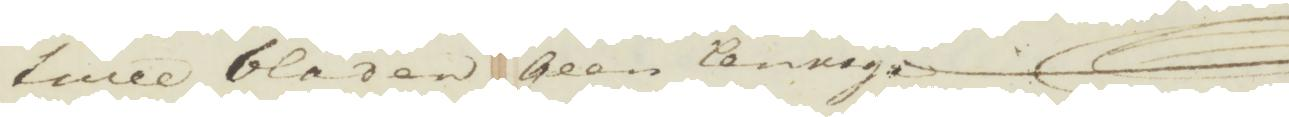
twee bladen geen Eenrige
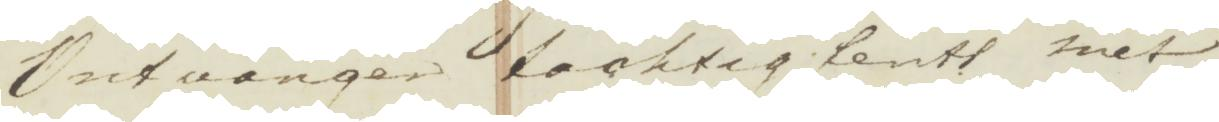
Ontvanger tachtig Cents met
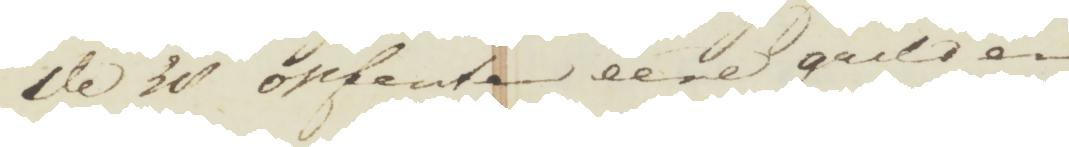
de 38 opCenten eene gulden
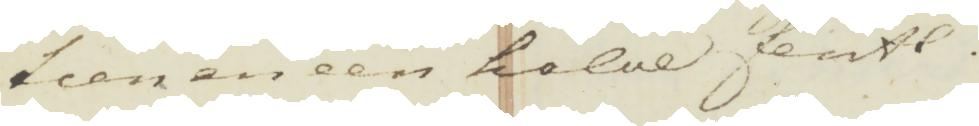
tien en een halve Cents.
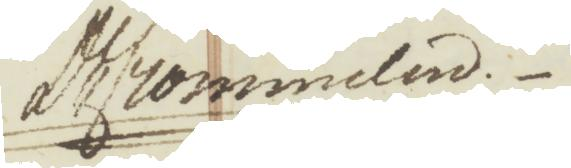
D„C Crommelin._
